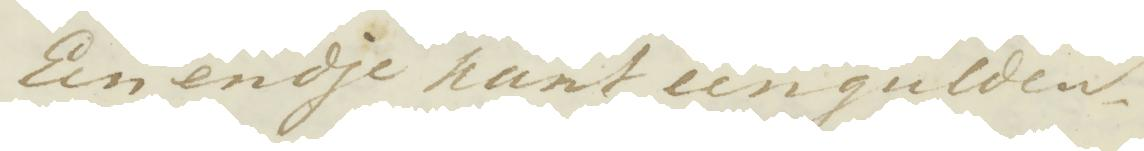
Een endje kant een gulden
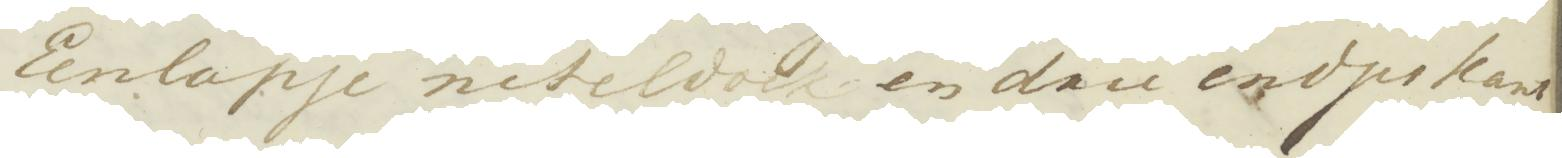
Een lapje neteldoek en drie endjes kant
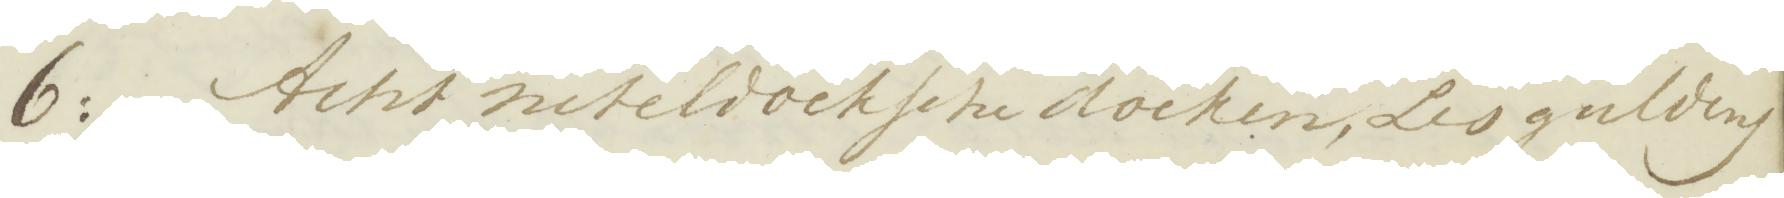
6: – Acht neteldoekjes doeken, zes guldens
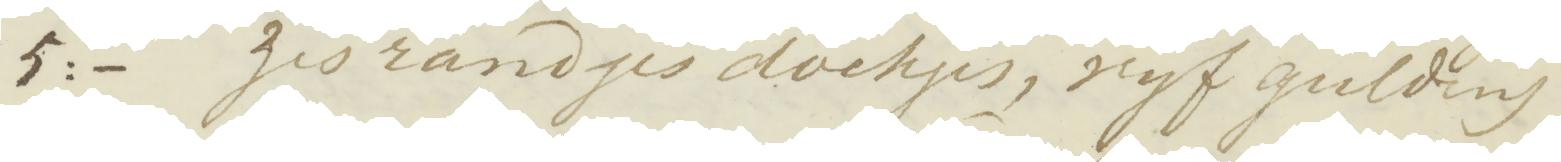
5: – zes randjes doekjes, vyf guldens
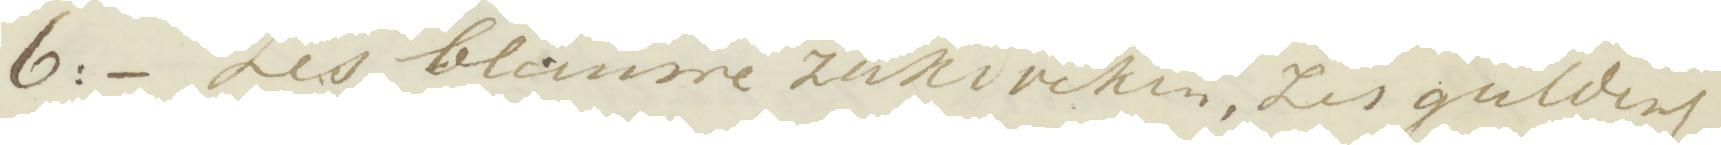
6: – zes blauwe zakdoeken, zes guldens
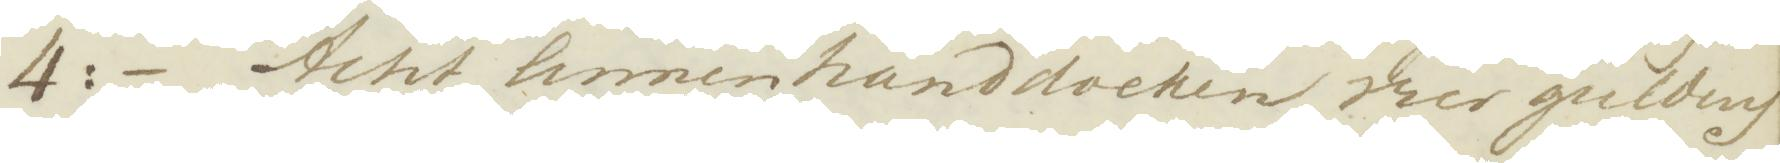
4: – Acht linnen hand doeken, vier guldens
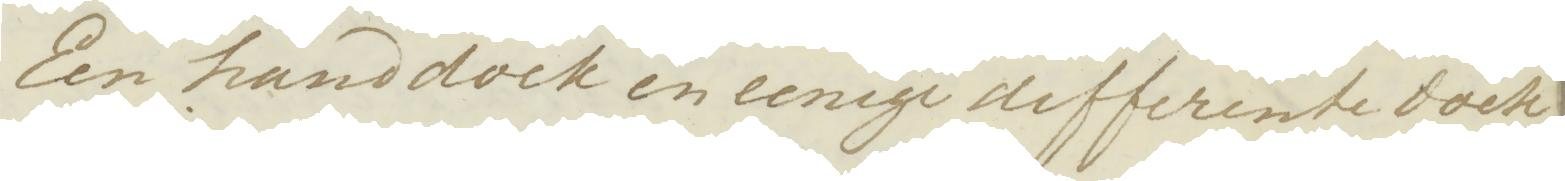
Een hand doek en eenige differente doek
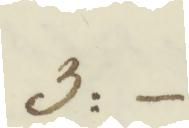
3: –
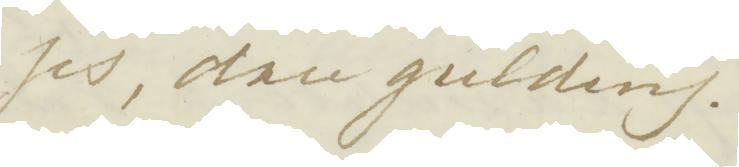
jes, drie guldens.
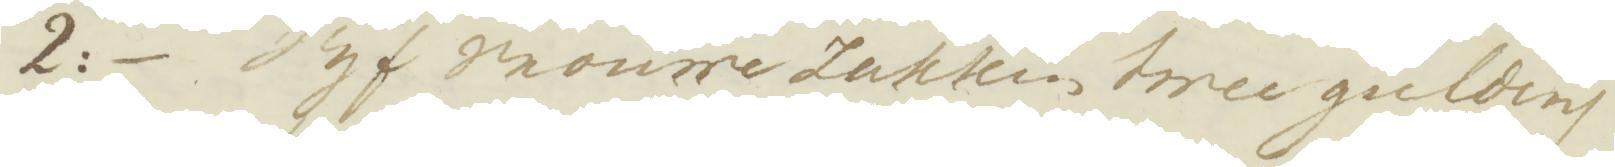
2: – Vyf vrouwe zakken twee guldens
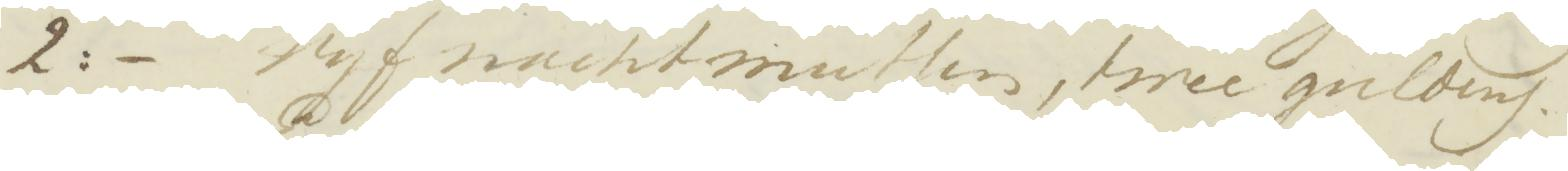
2: – Vyf nachtmutsen, twee guldens.
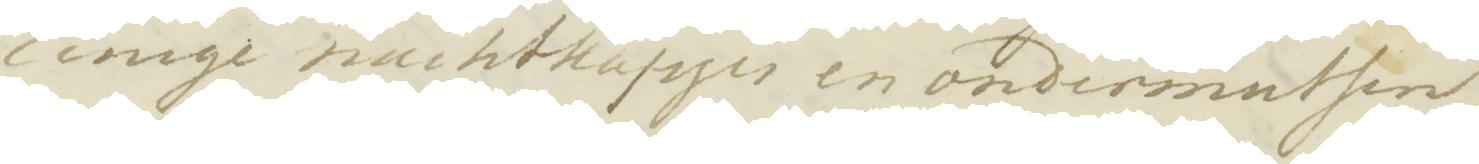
Eenige nachtkapjes en ondermutsen
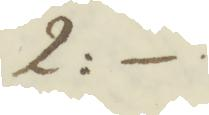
2: –
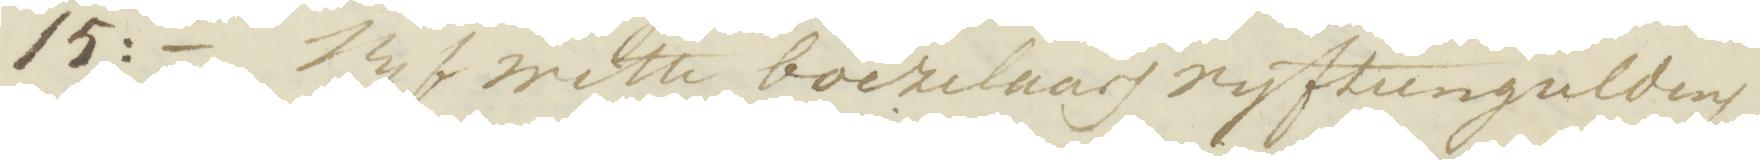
15: – Vyf wette boezelaars vyftien guldens
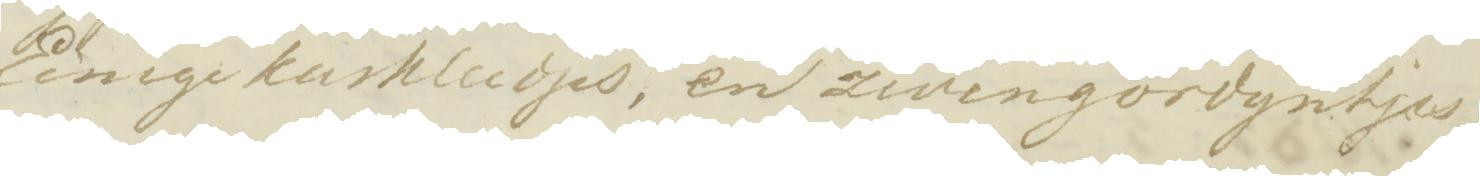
Eenige kaskleedjes, en zeven gordyntjes
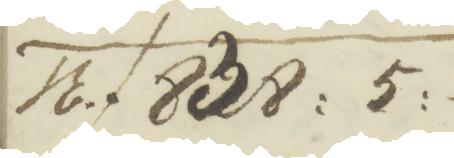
Tr. ƒ 838: 5:
